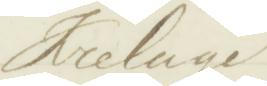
Krelage
